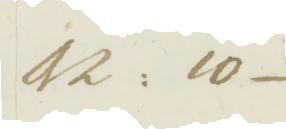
42: 10 —
